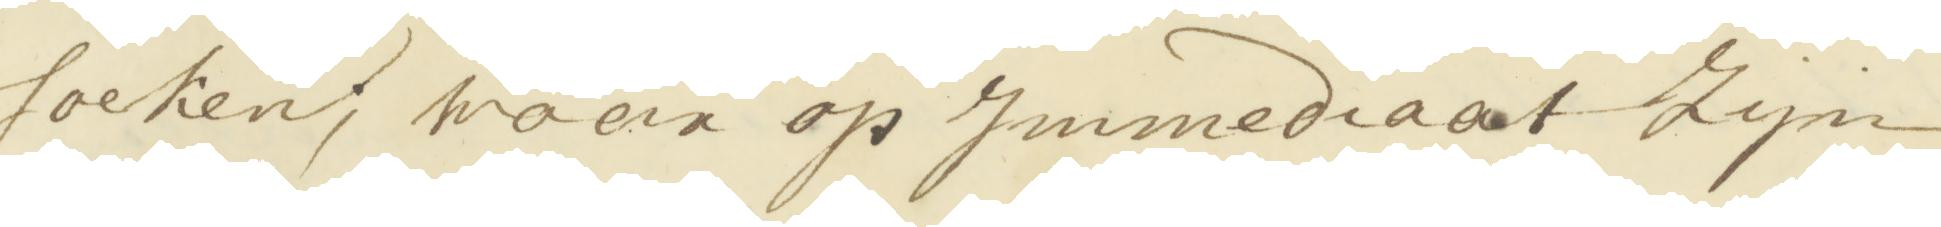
soeken; waar op Immediaat Zijn
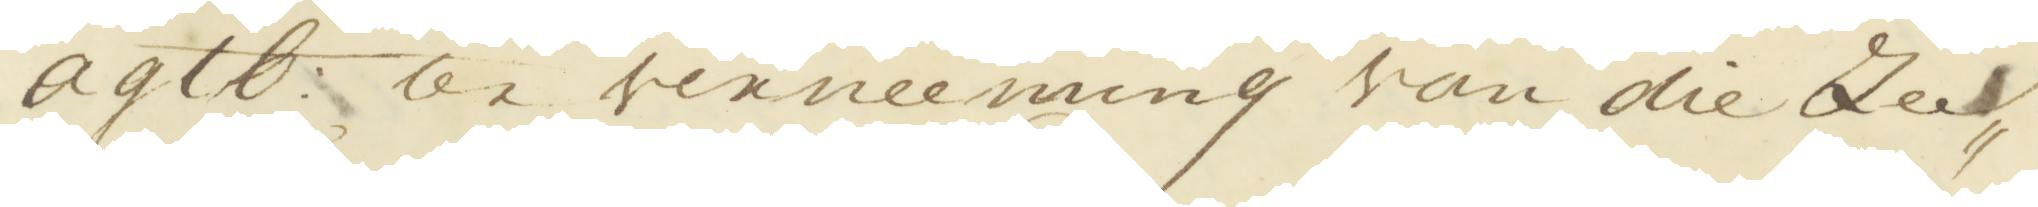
agtb: ter verneeming van die Zee„
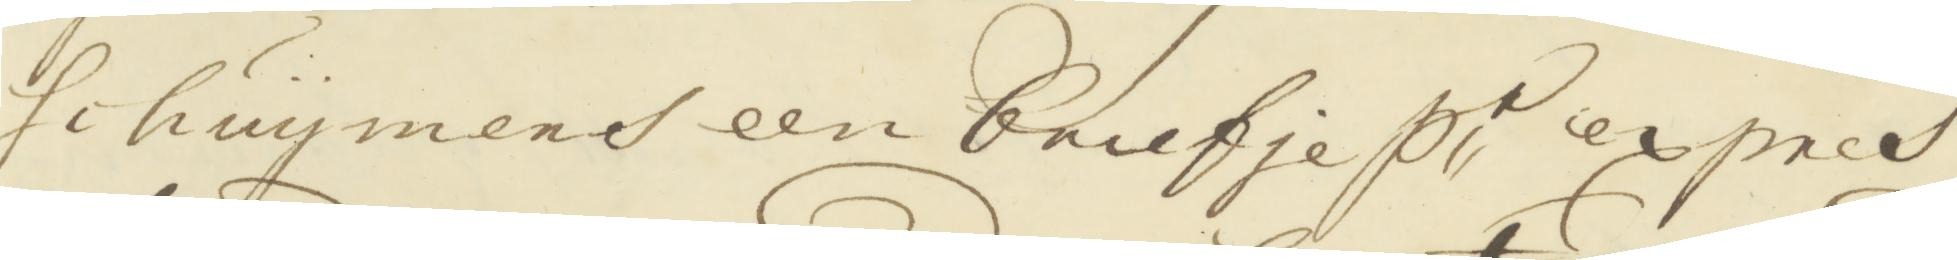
Schuijmers een briefje p„r expres
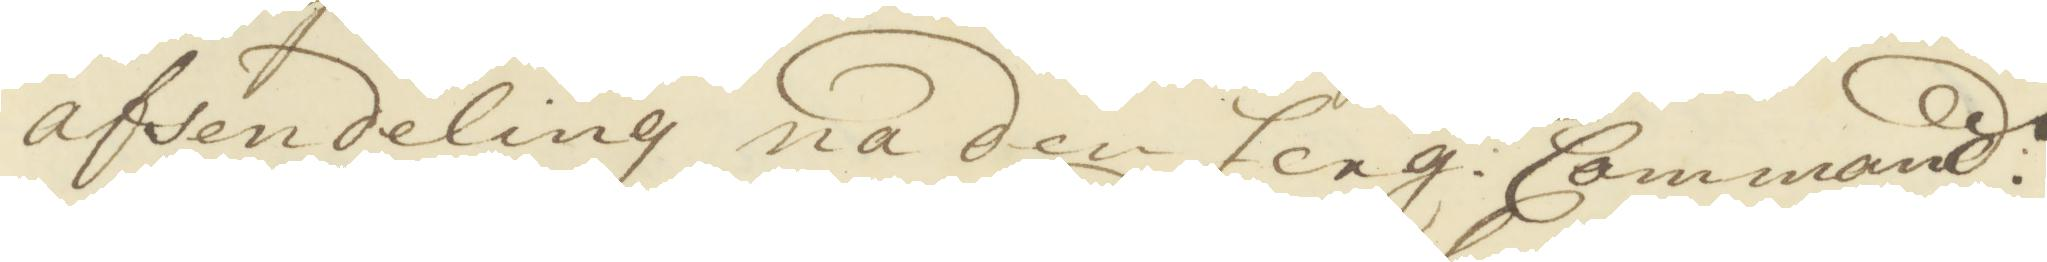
afsendeling na den Serg:t Command:t
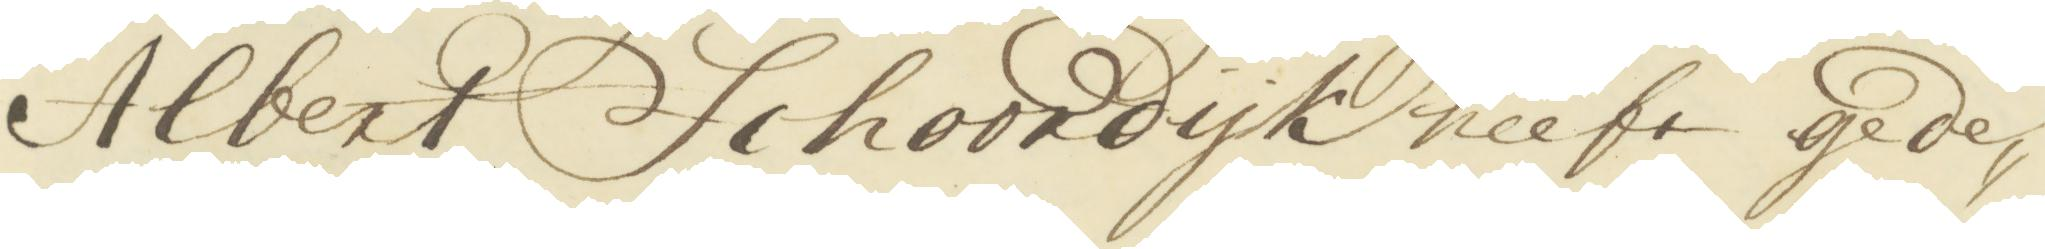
Albert Schoordijk heeft gede
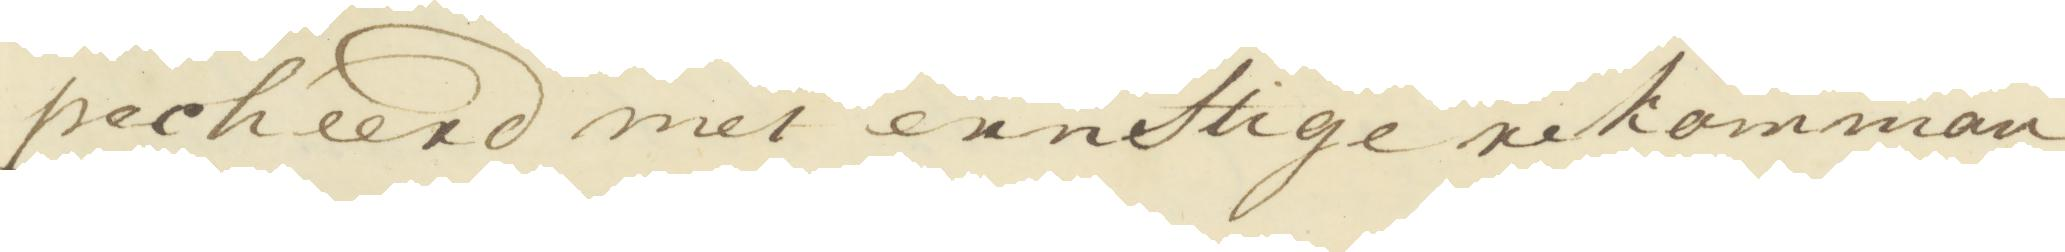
pecheerd met ernstige rekomman
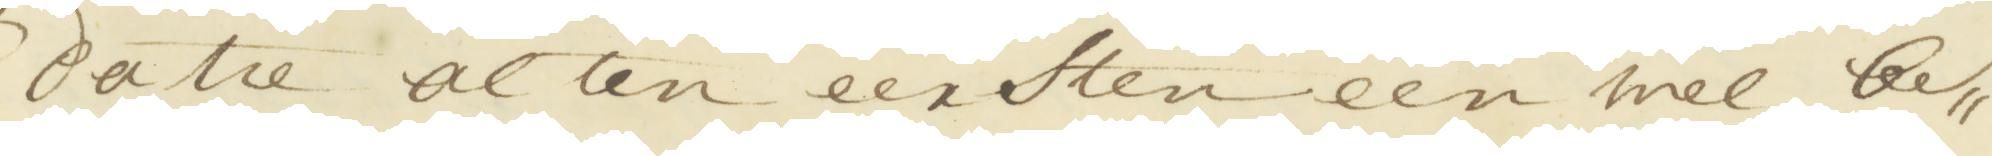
datie al ten eersten een wel be„
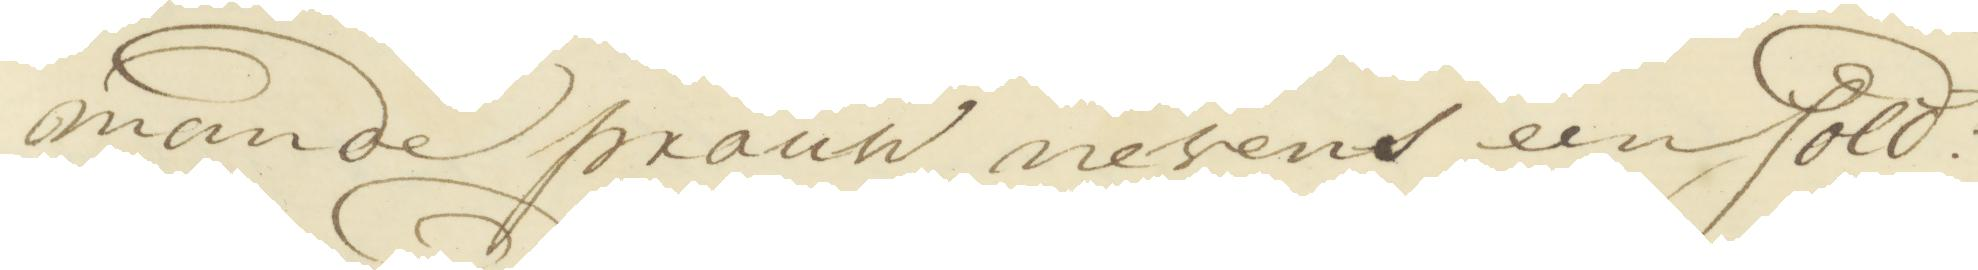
mande prauw nevens een sold:t
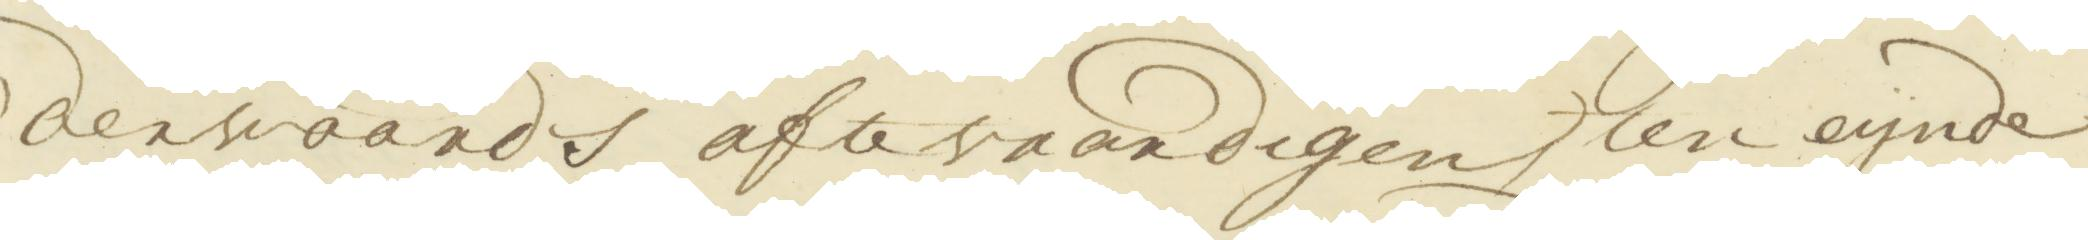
derwaards af te vaardigen ten eijnde
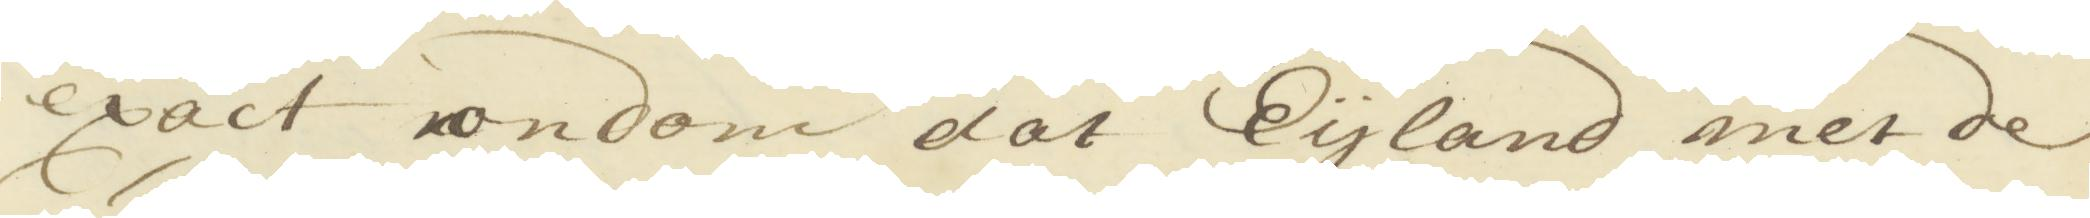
exact rondom dat Eijland met de
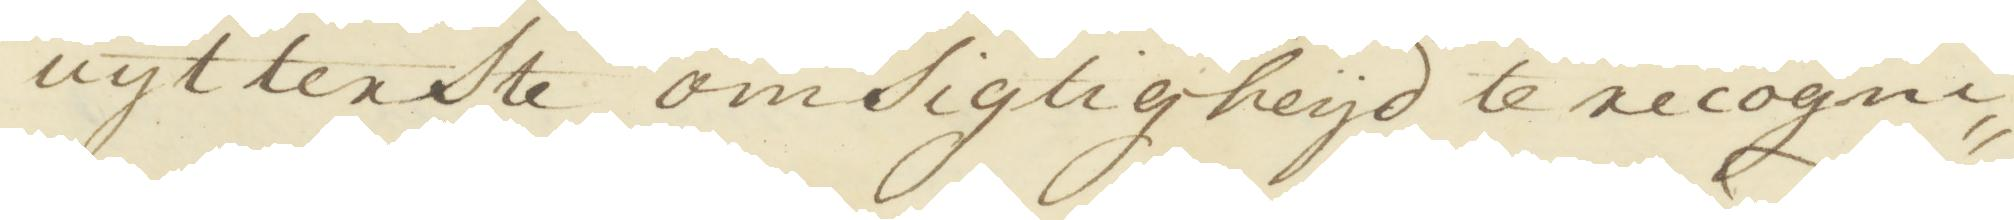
uijtterste omsigtigheijd te recogni„
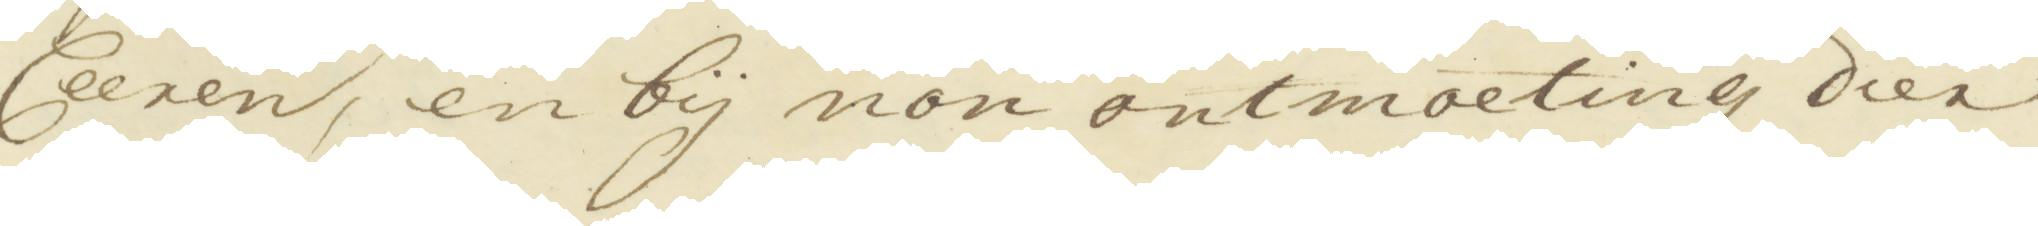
Ceeren, en bij non ontmoeting dier
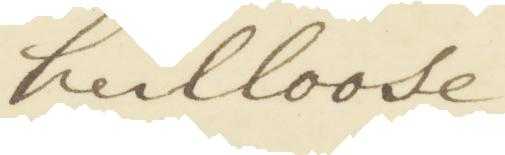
heilloose
